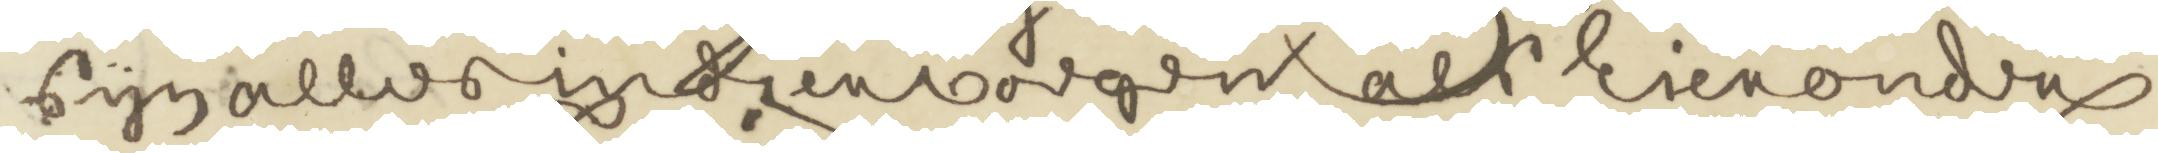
sijn alles in diervoegen als hieronder
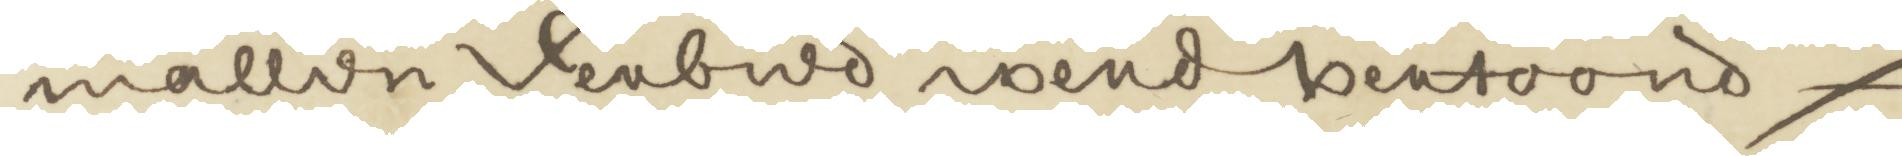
in allen Eerbied werd vertoond
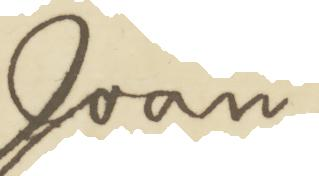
joan
